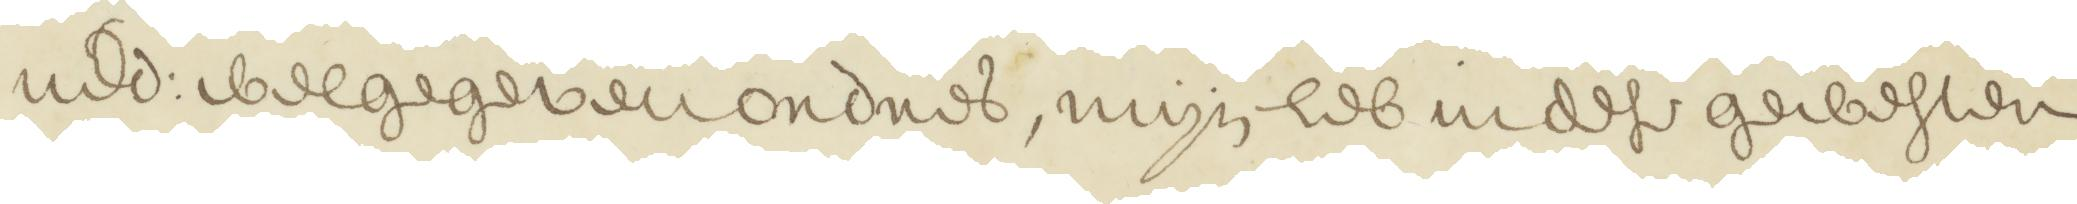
uEd: welgegeven ordres, mijn heb in dese gewesten
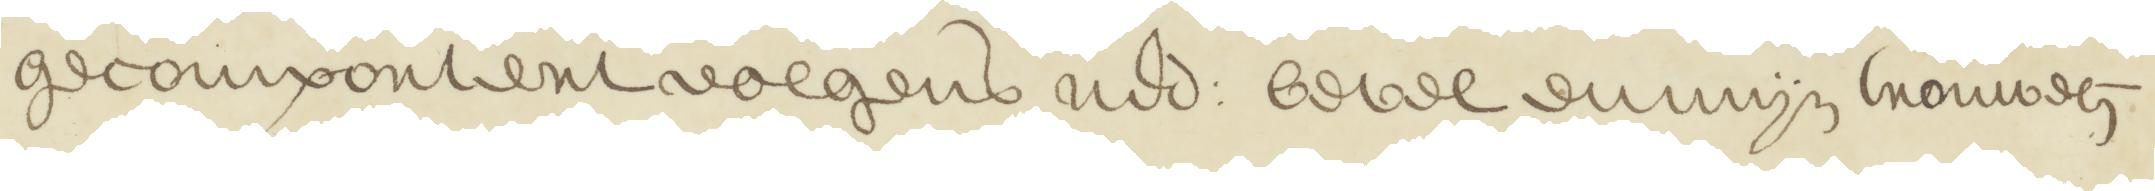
gecomportert volgens uEd: bevel en mijn trouwelijk
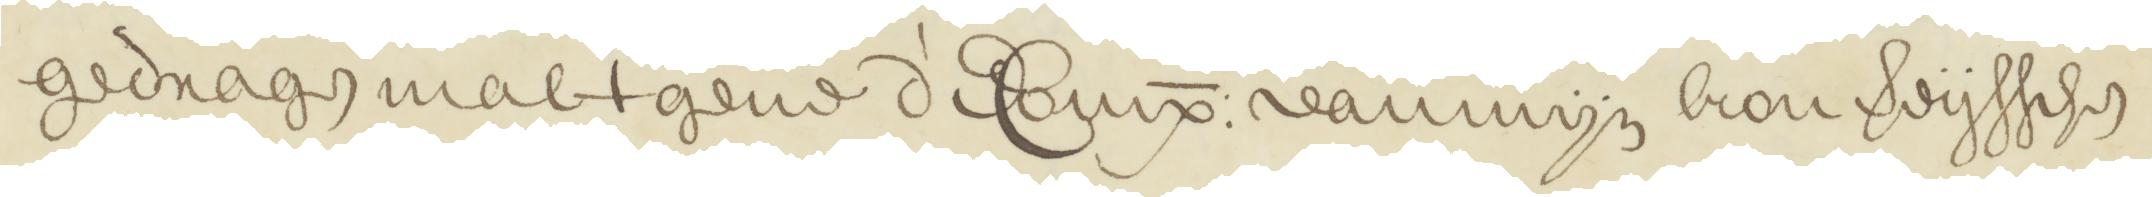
gedragen in al 't gene d'EComp: van mijn kon vereijsschen
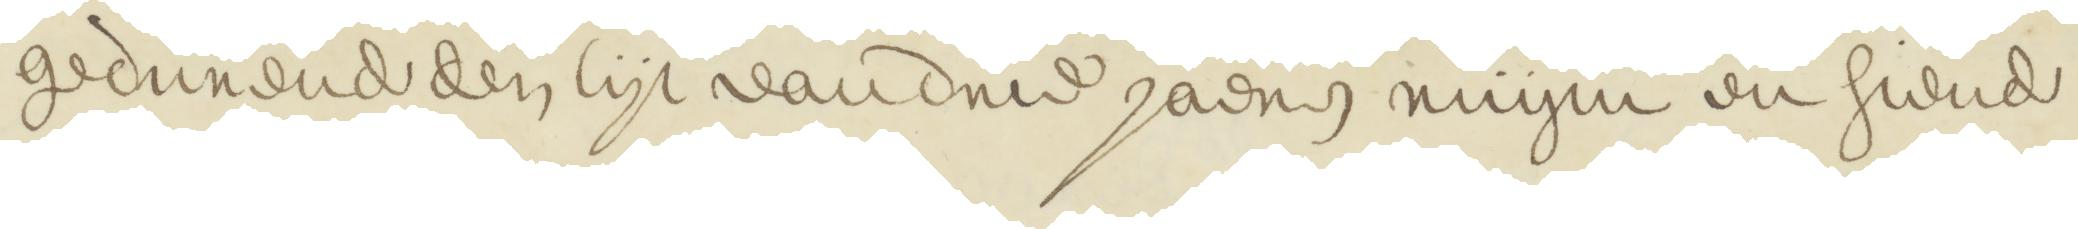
gedurende den tijt van drie jaeren ruijm en siende
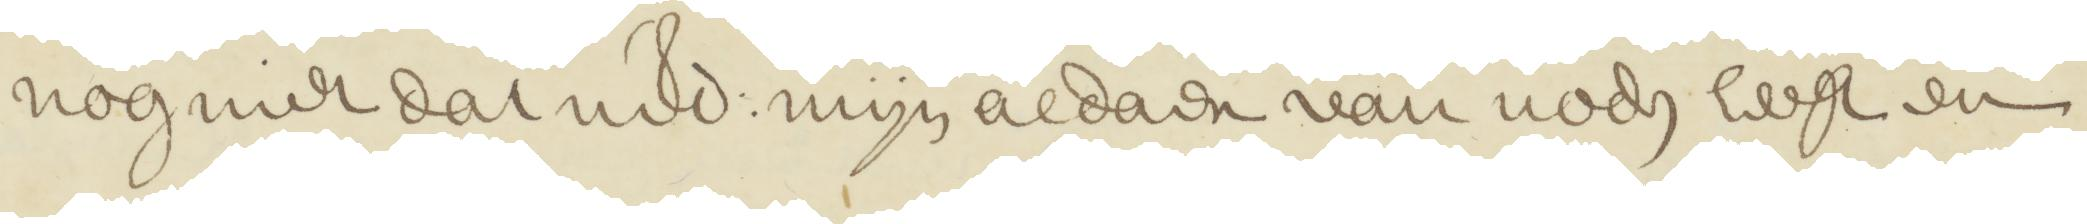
nog niet dat uEd: mijn aldaer van noden heeft en
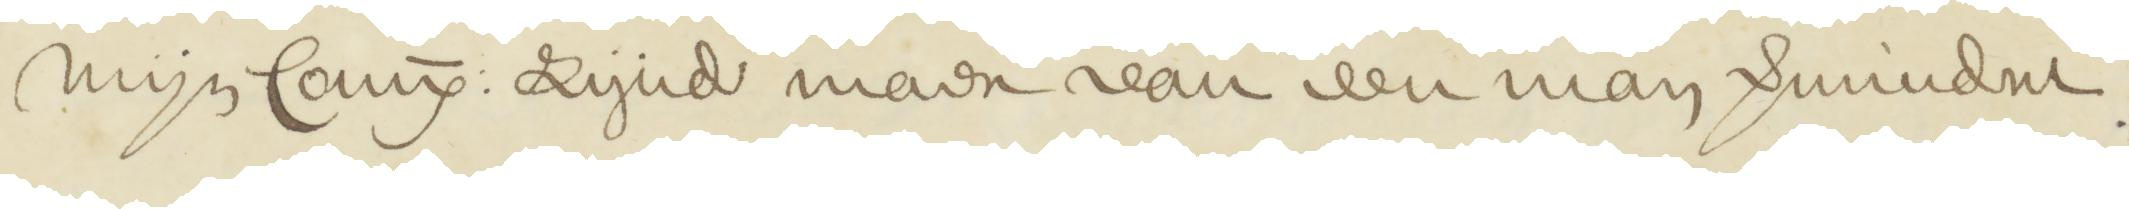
mijn Comp: zijnde maer van een man vermindert
